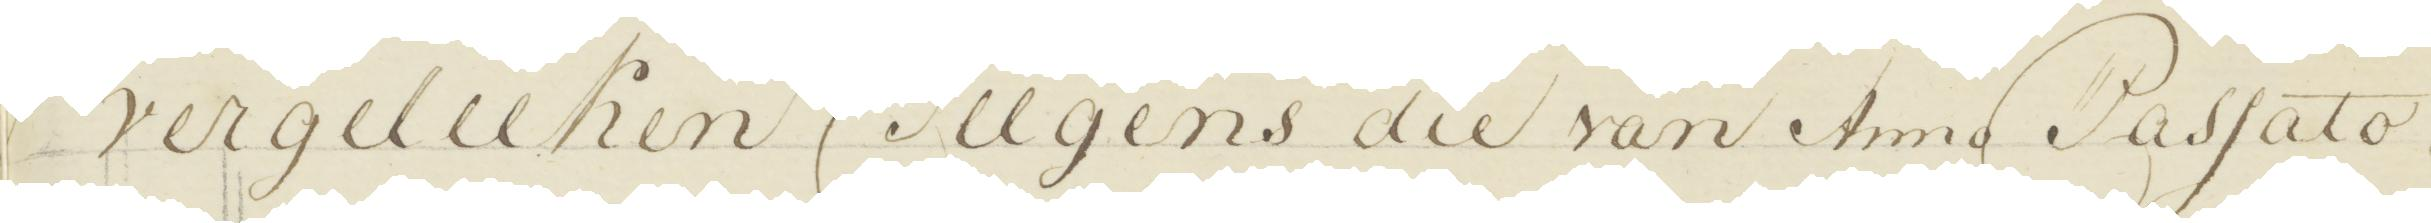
Vergeleeken Teegens die van Anno Passato
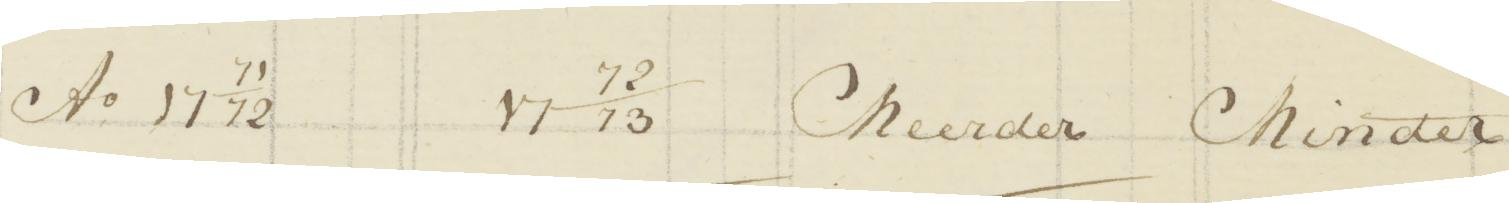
Ao 1771/72 1772/73 Meerder Minder
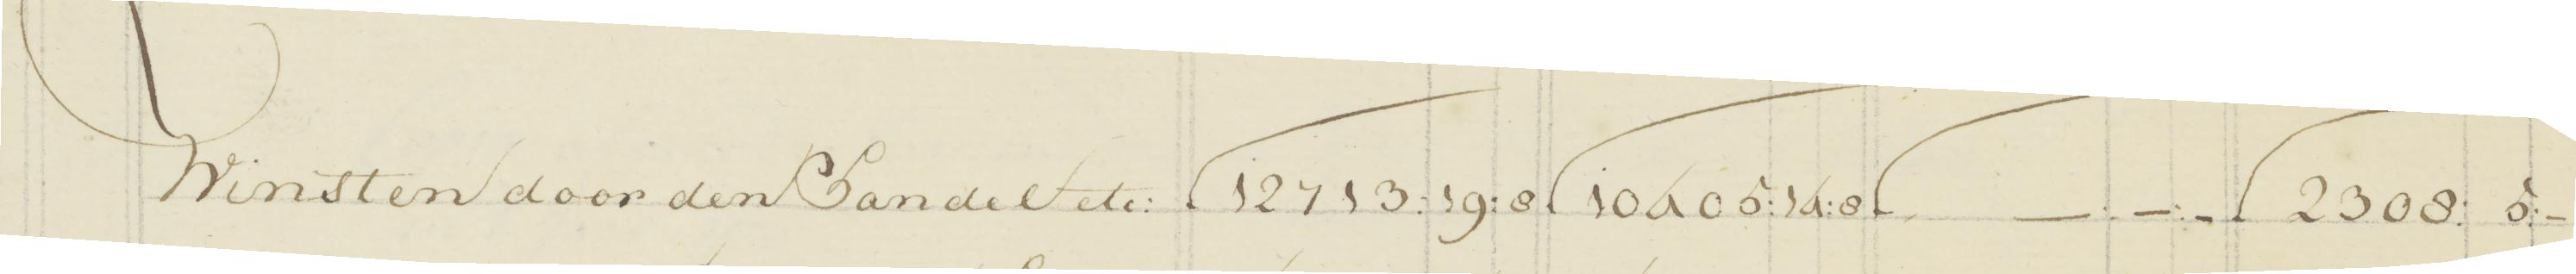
Winsten door den Handel etc: ƒ12713:19:8 ƒ10405:14:8ƒ—:—:—ƒ 2308: 5:—
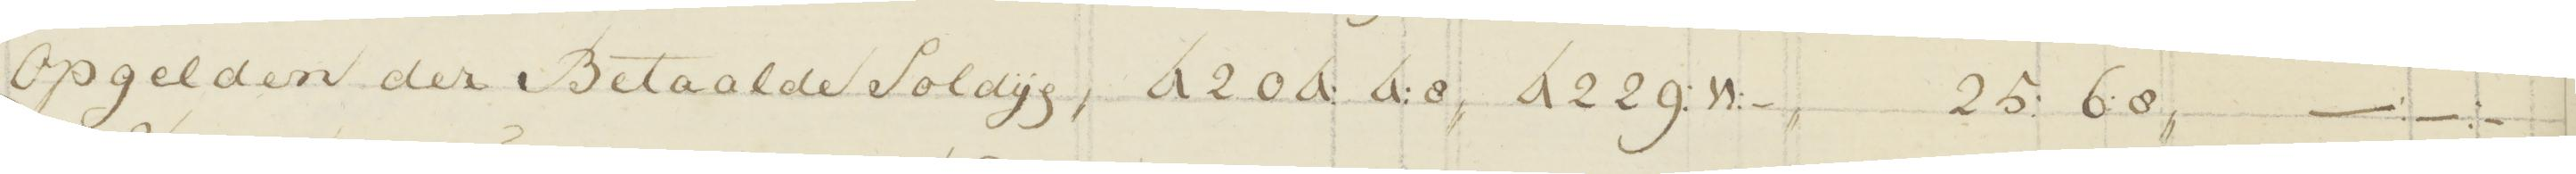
Opgelden der Betaalde soldijen„ 4204: 4:8„ 4229:11:—„ 25: 6:8„ —:–:-
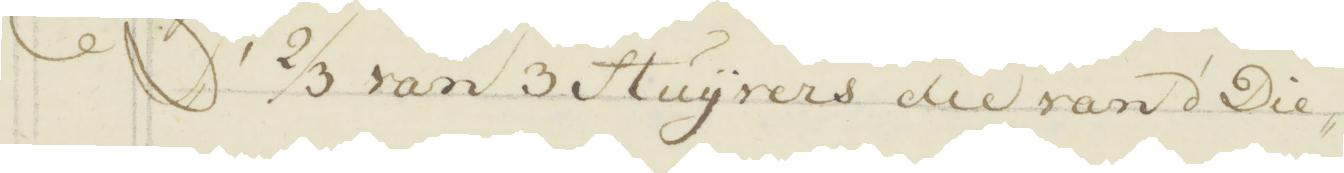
D'2/3 van 3 stuijvers die van d' Die„
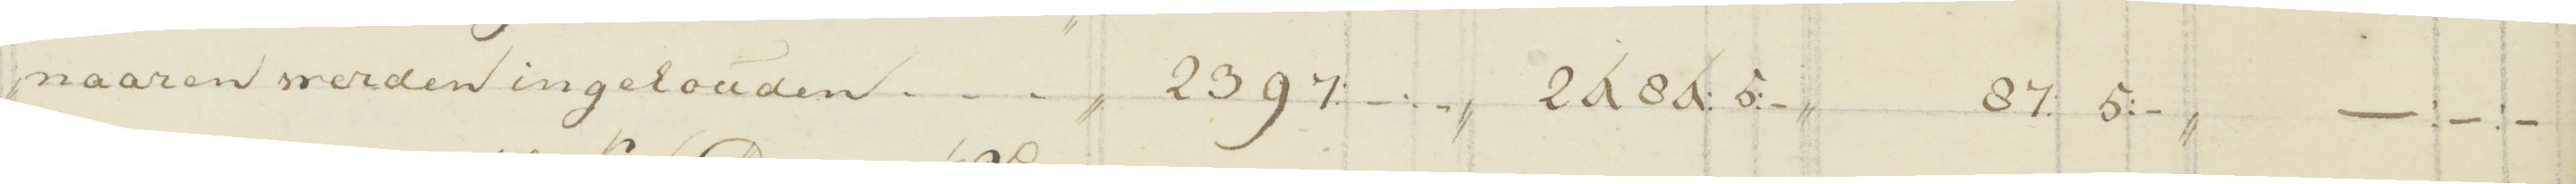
„naaren werden ingehouden - - - „ 2397:–:-„ 2484: 5:-„ 87:5:- „ —:–:-
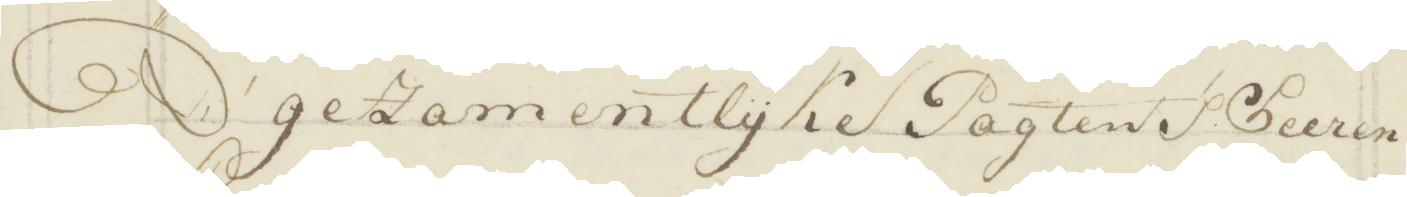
D’gezamentlijke Pagten 's Heeren
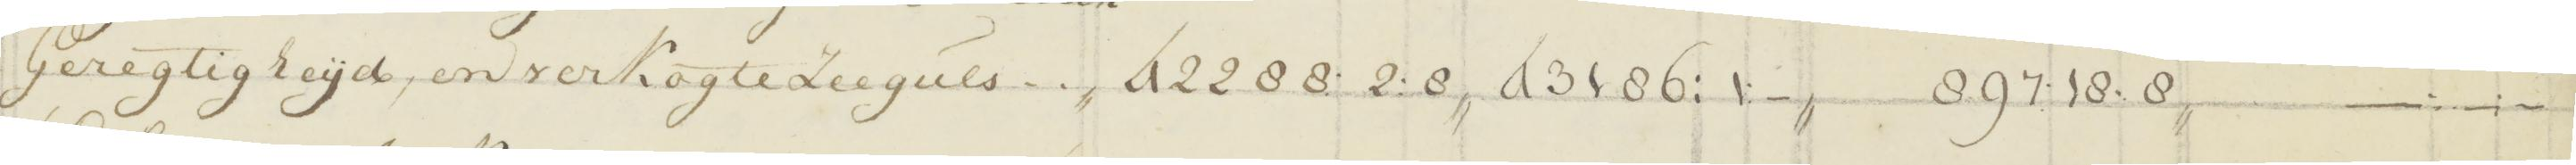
Geregtigheijd, en verkogte zeeguls - . „42288: 2:8„ 43186: 1:–„ 897:18:8„ —:–:–
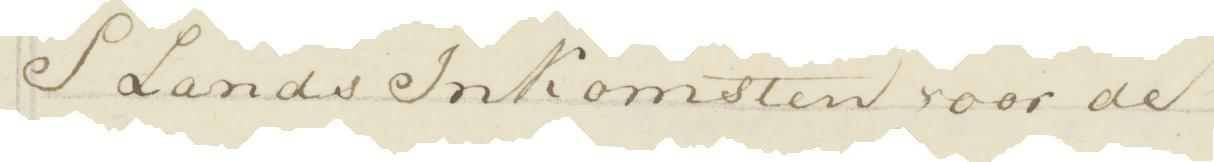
's Lands Inkomsten voor de
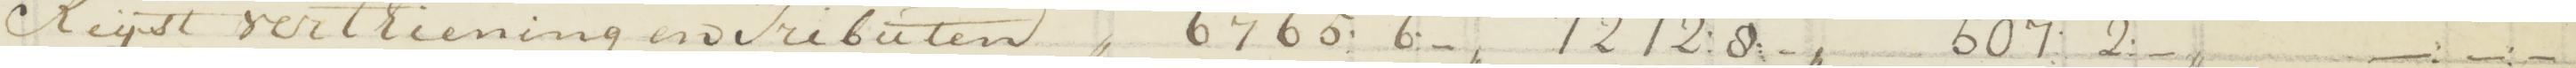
Reijst verthiening en Tributen „ 6765: 6:–„ 7272:8:–„ 507: 2:–„ —:–:–
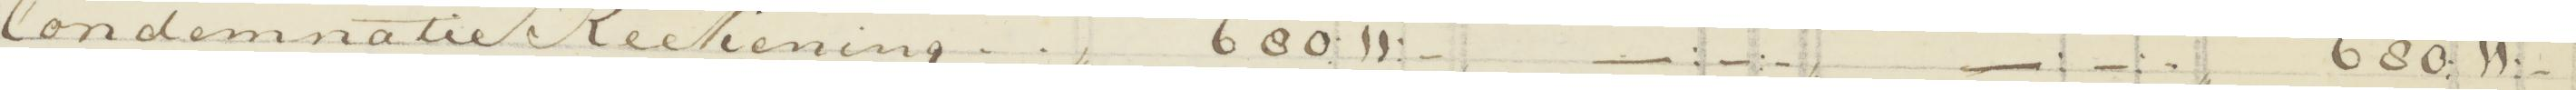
Condemnatie Reekening . . „ 680: 11:– —:–:-„ —:–:-„ 680: 11:–
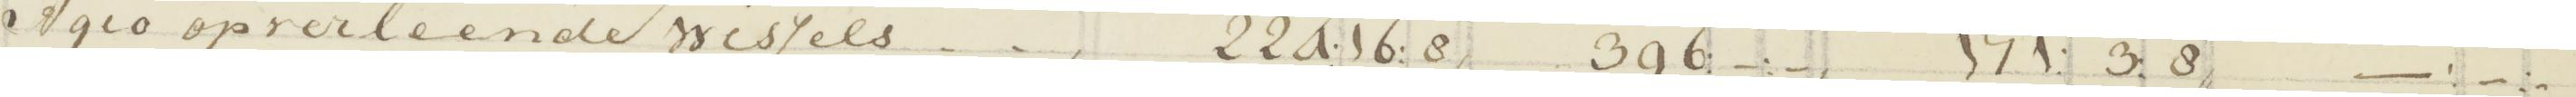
Agio op verleende wissels - - „ 224:16:8„ 396:–:–„ 171: 3: 8„ —:–:-
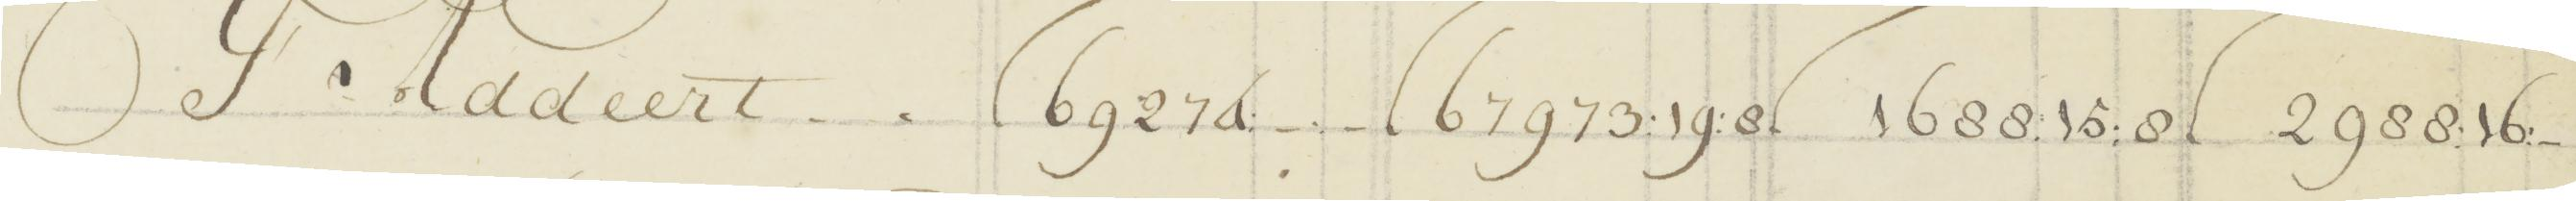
G' Addeert - . ƒ 69274:—:—ƒ67973:19:8ƒ 1688:15:8ƒ 2988:16:–
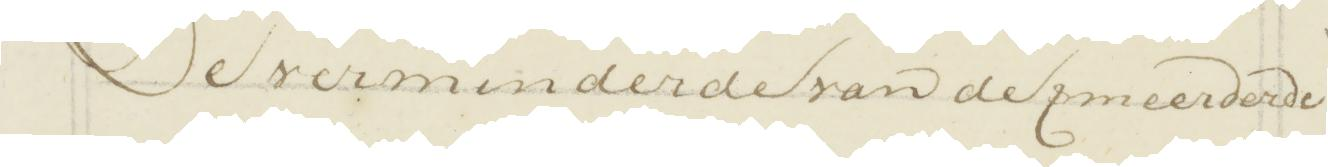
De verminderde van de vermeerderde
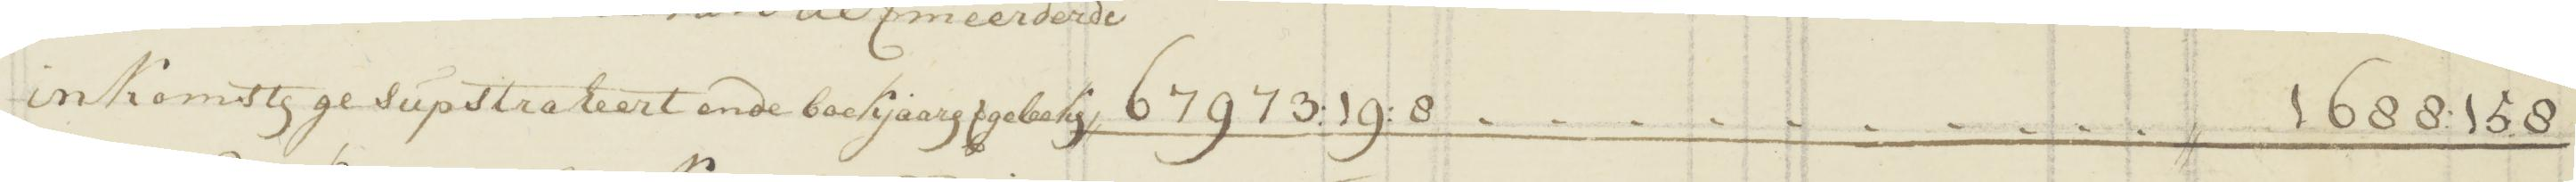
inkomsten gesupstrateert ende boekjaaren vergeleeken„ 67973:19:8 - - - - - - - - . . „1688:15:8
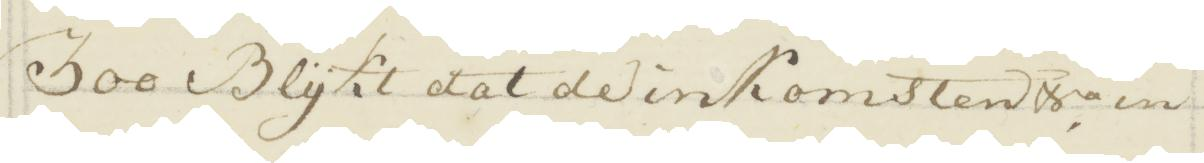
Zoo Blijkt dat de inkomsten &,a in
